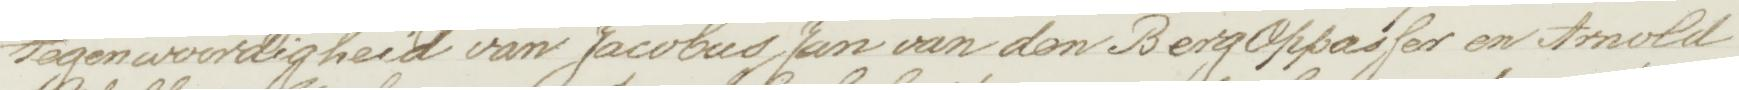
tegenwoordigheid van Jacobus, Jan van den Berg Oppasser en Arnold
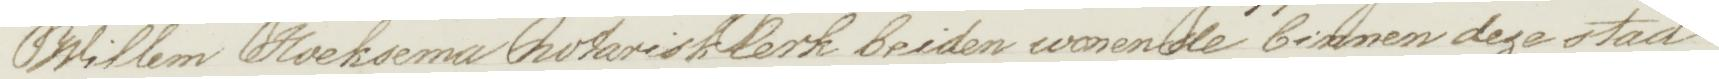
Willem Hoeksema Notarisklerk beiden wonende binnen deze stad
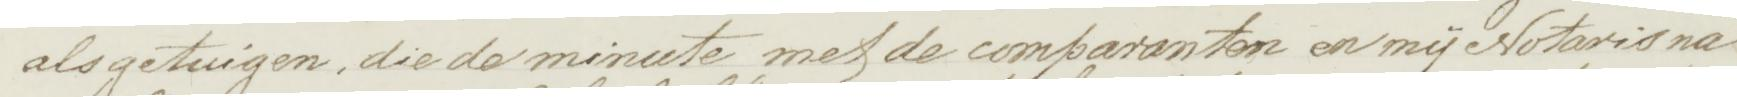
als getuigen, die de minute met de comparanten en mij Notaris na
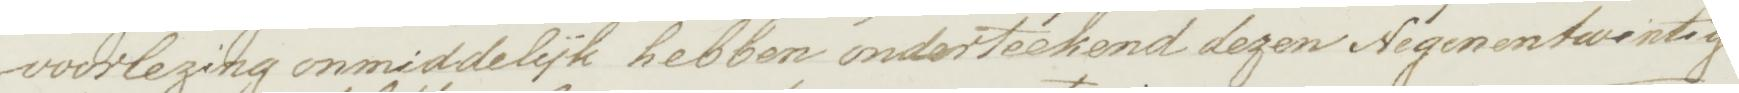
voorlezing onmiddelijk hebben onderteekend dezen Negenentwintig
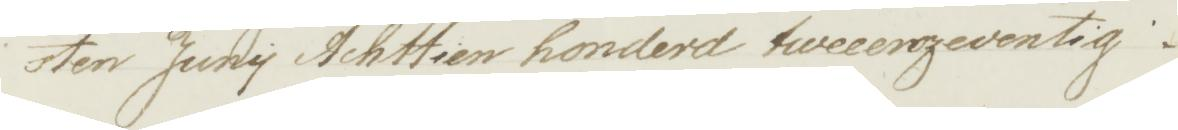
sten Junij Achttien honderd tweeenzeventig
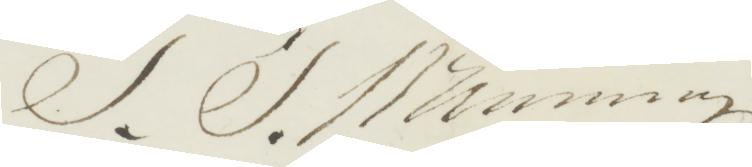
J. J. Wammer
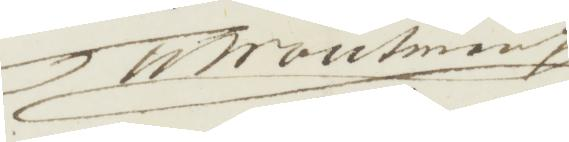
W Woutman
